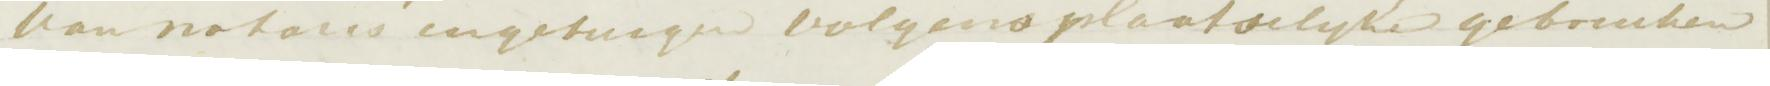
van notaris en getuigen volgens plaatselyke gebruiken
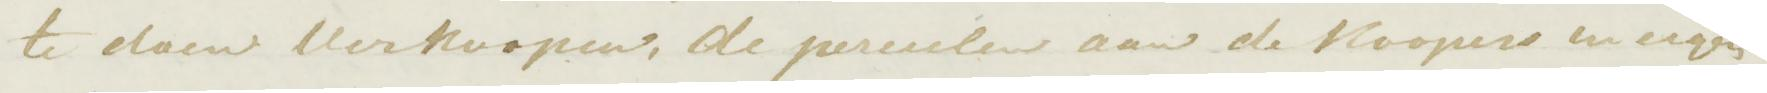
te doen verkoopen, de perceelen aan de koopers in eigen
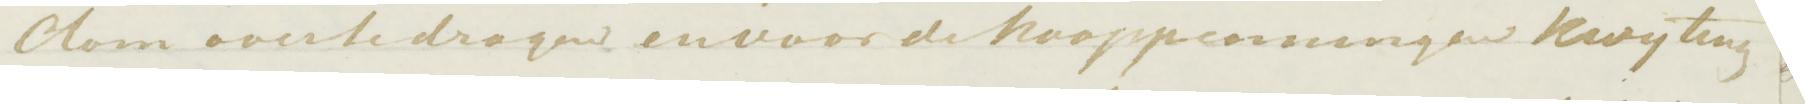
dom over te dragen en voor de kooppenningen kwyting
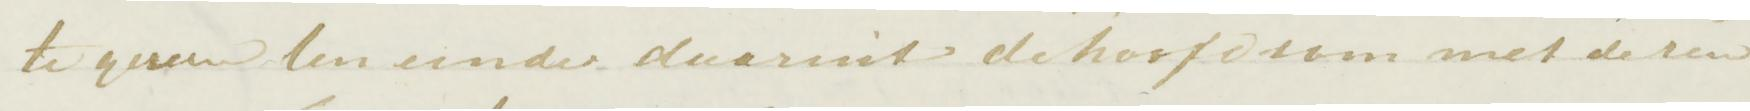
te geven ten einde daaruit de hoofdsom met de ren
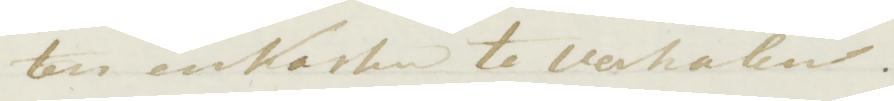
ten en kosten te verhalen.
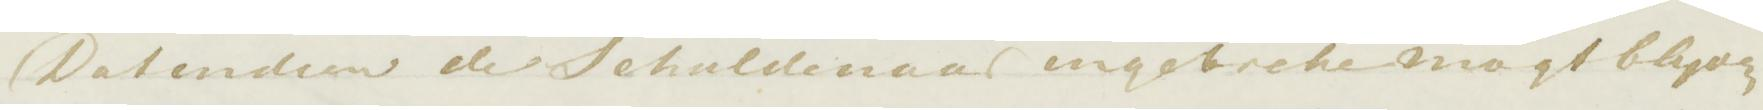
Dat indien de schuldenaar ingebreke mogt blyken
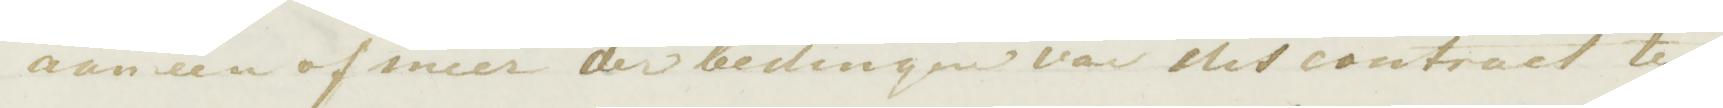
aan een of meer der bedingen van dit contract te
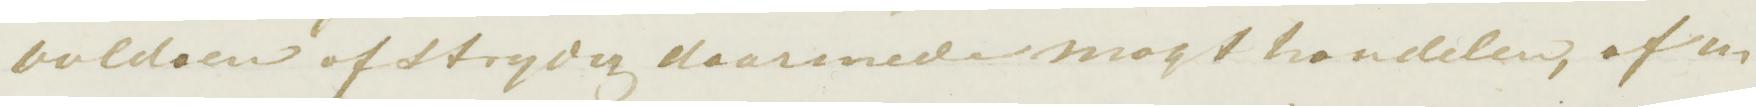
voldoen of stryden daarmede mogt handelen, of in
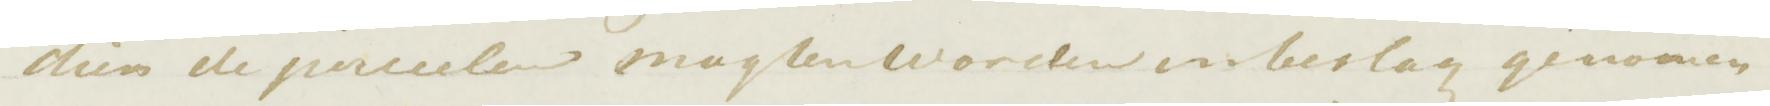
dien de perceelen mogten worden in beslag genomen
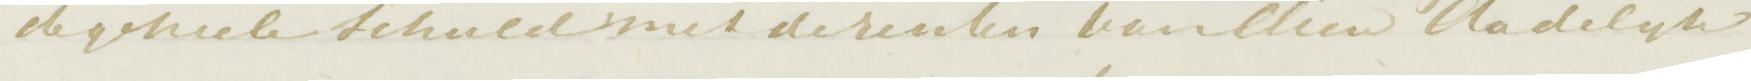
de geheele schuld met de renten van dien Dadelijk
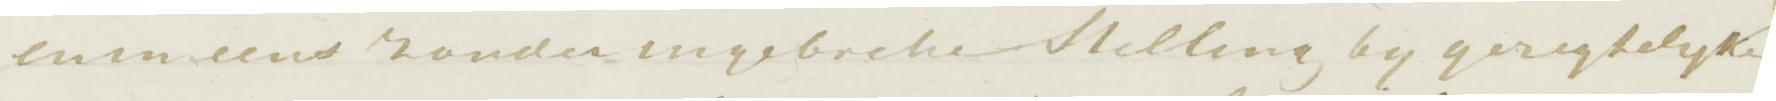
en in eens zonder ingebreke stelling by geregtelyke
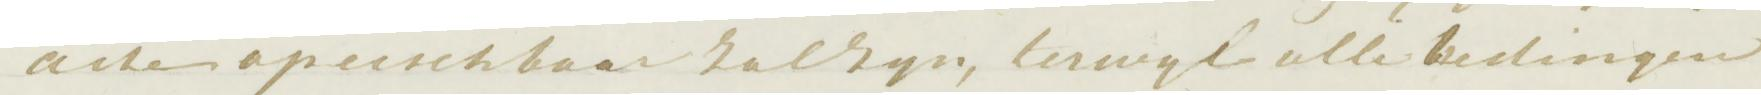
acte op eischbaar zal zyn, terwyl alle bedingen
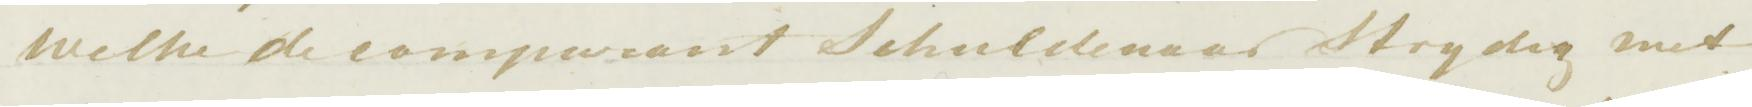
welke de comparant schuldenaar strydig met
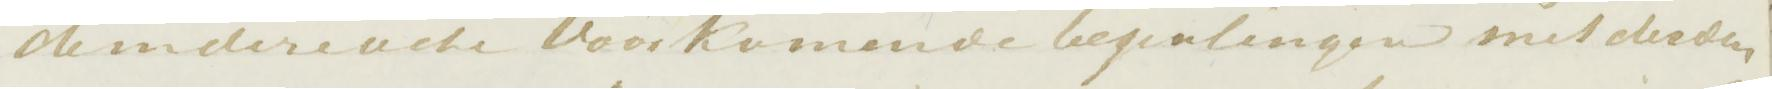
de in deze acte voorkomende bepalingen met derden
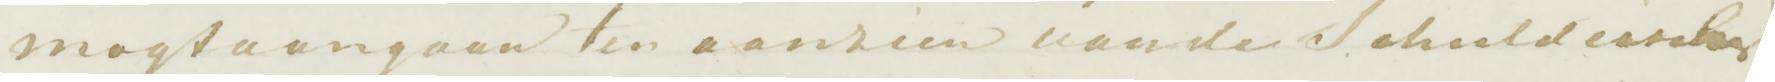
mogt aangaan ten aanzien van de schuldeischer
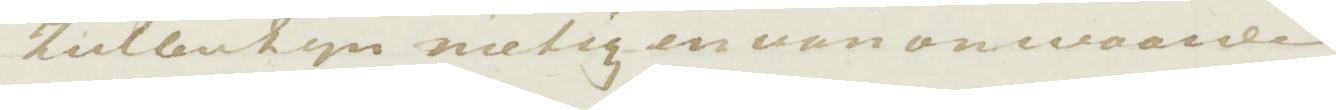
zullen zyn nietig en van onwaarde
